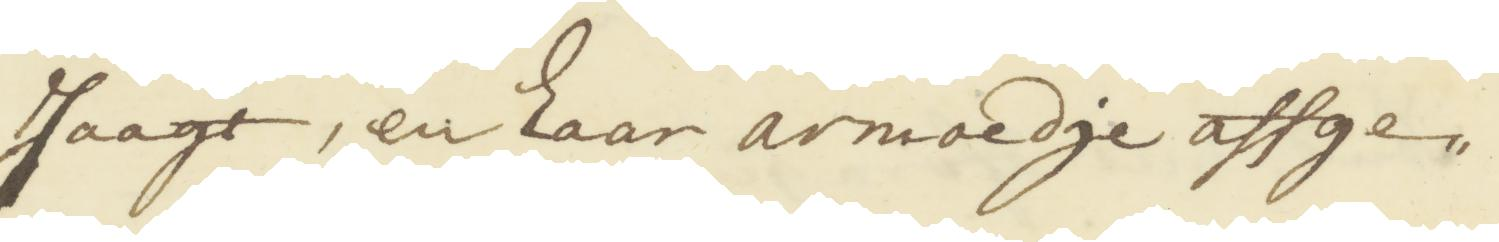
jaagt, en haar armoedje affge„
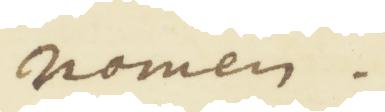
nomen.
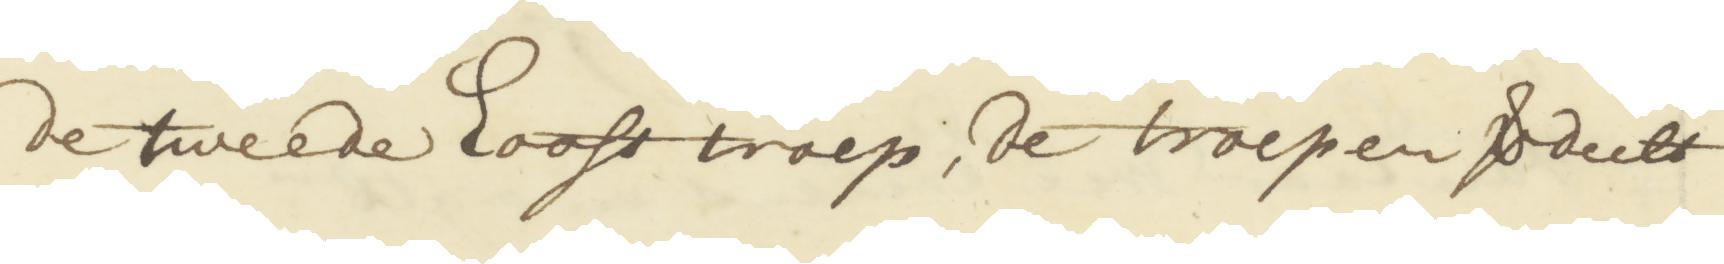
de tweede hooft troep, de troepen verdeelt
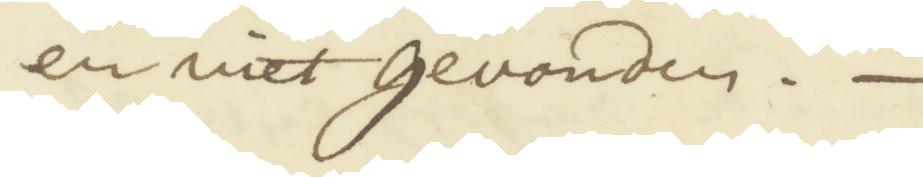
en niet gevonden. —
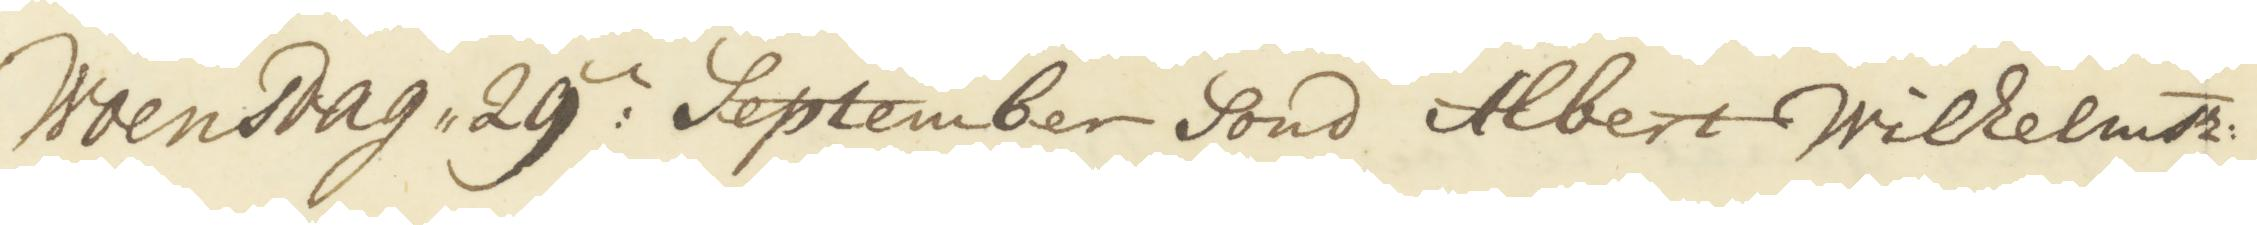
Woensdag „ 29:e September sond Albert Wilhelmsz:
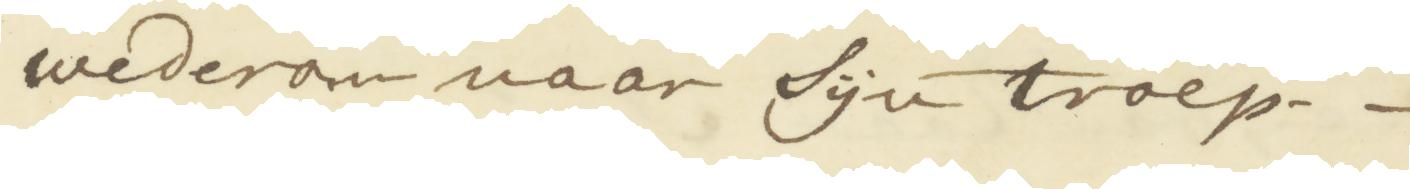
wederom naar sijn troep. —
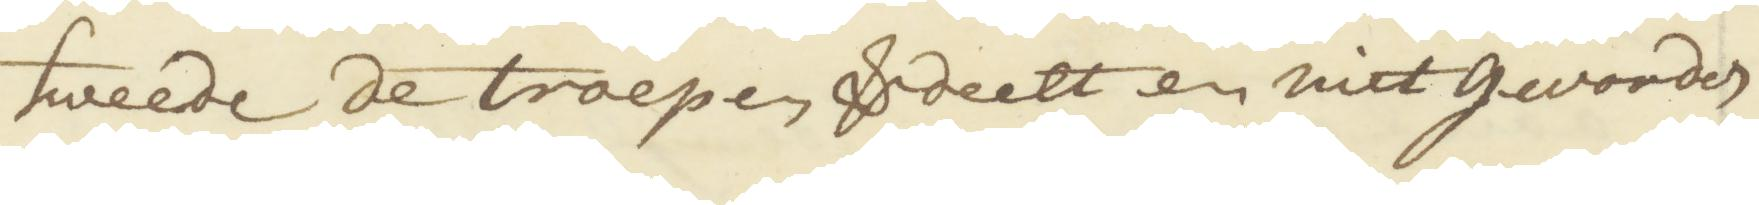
tweede de troepen verdeelt en niet gevorden
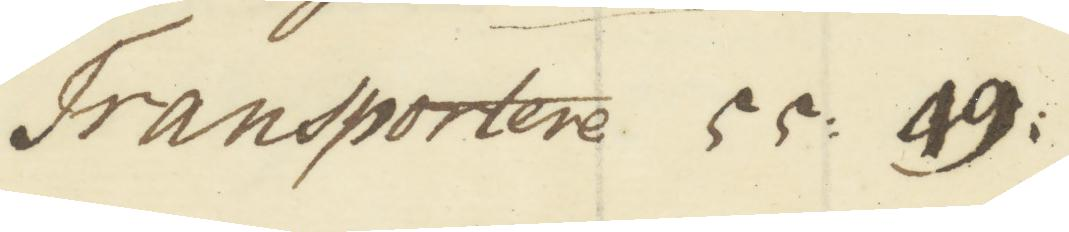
Transportere 55: 49:
